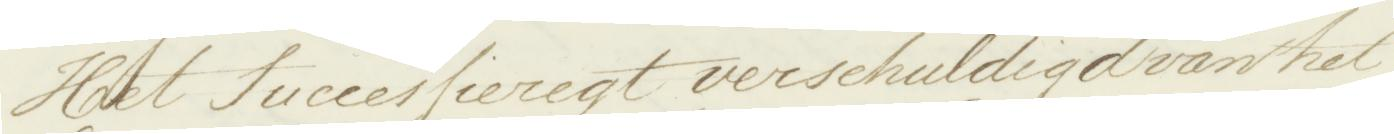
Het Successieregt verschuldigd van het
